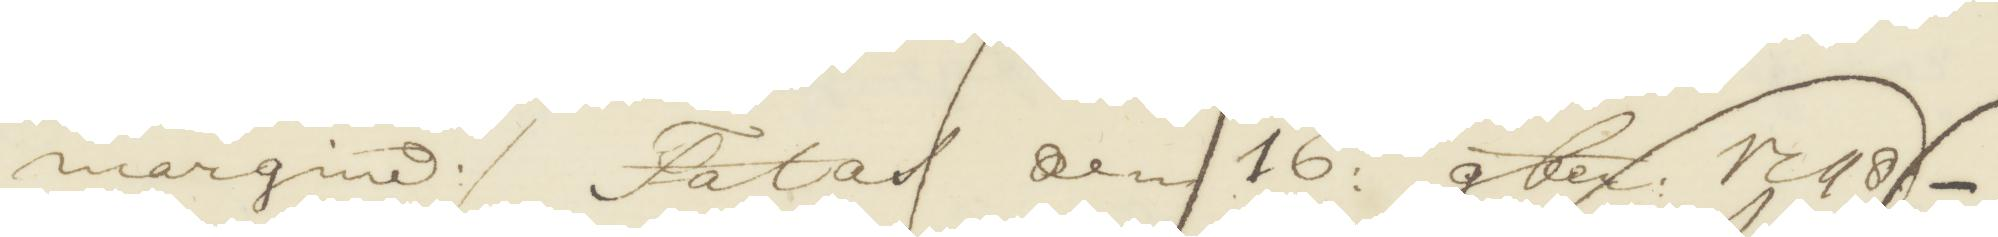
margine :/ Fatas den 16:' 9ber: 1748 —
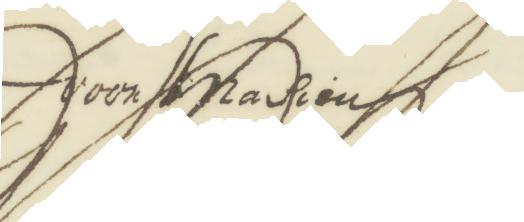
voor t nasien
